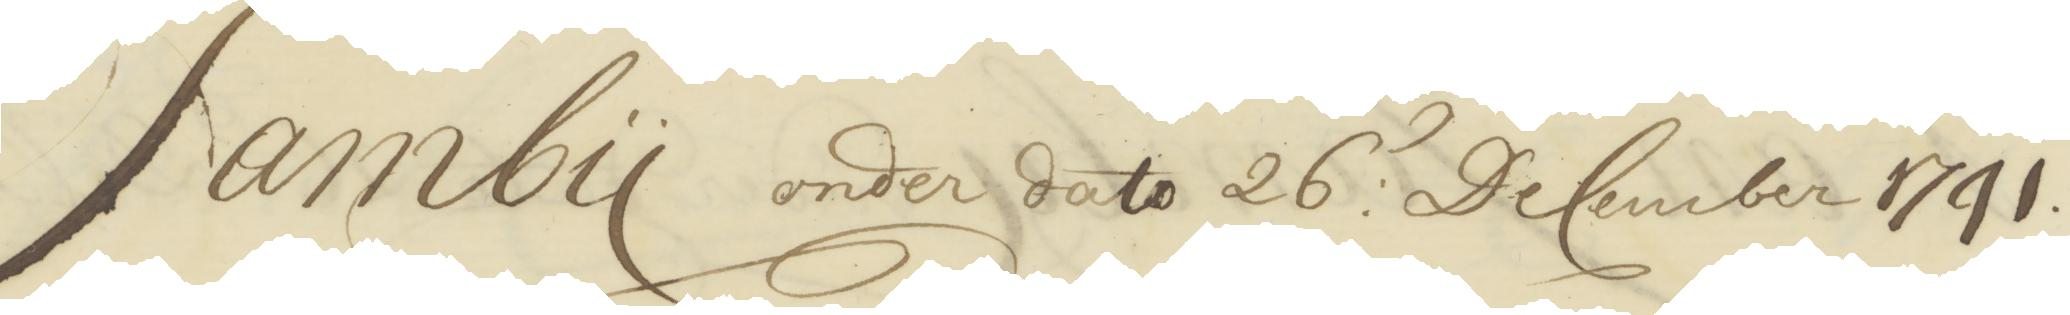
Van Jambij onder dato 26:' December 1741.
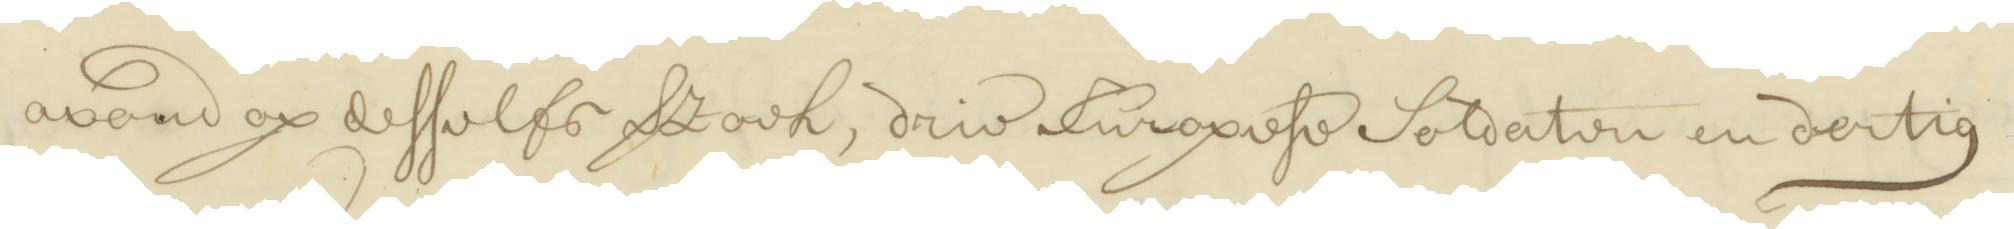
avond op desselfs verzoek, drie Europese soldaten en dertig
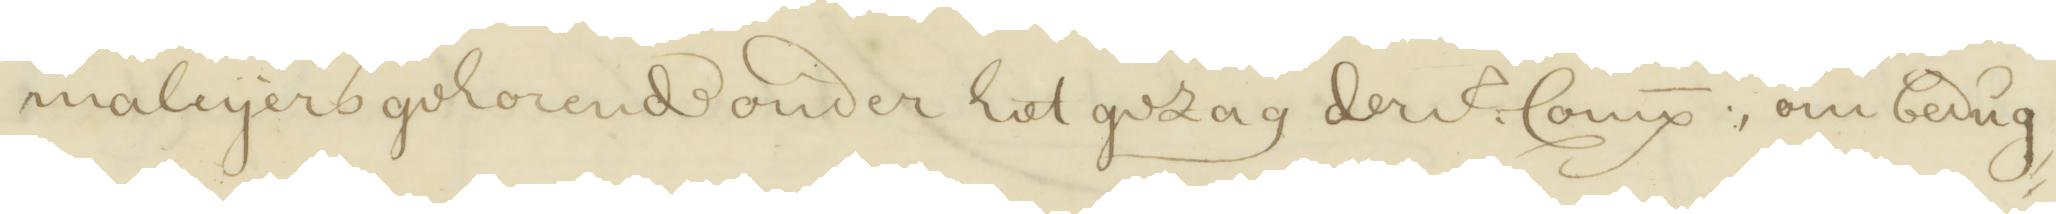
maleijers gehorende onder het gezag der E:Comp:, om bedug„
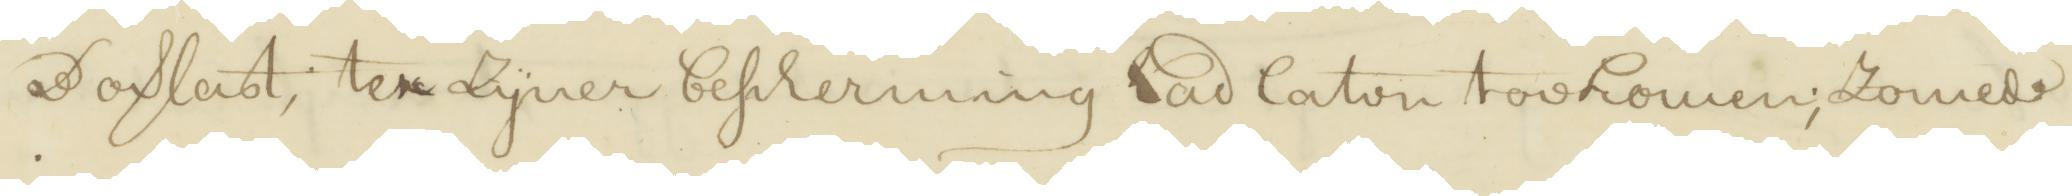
te overlust, ter zijner bescherming had laten toekomen, zo mede
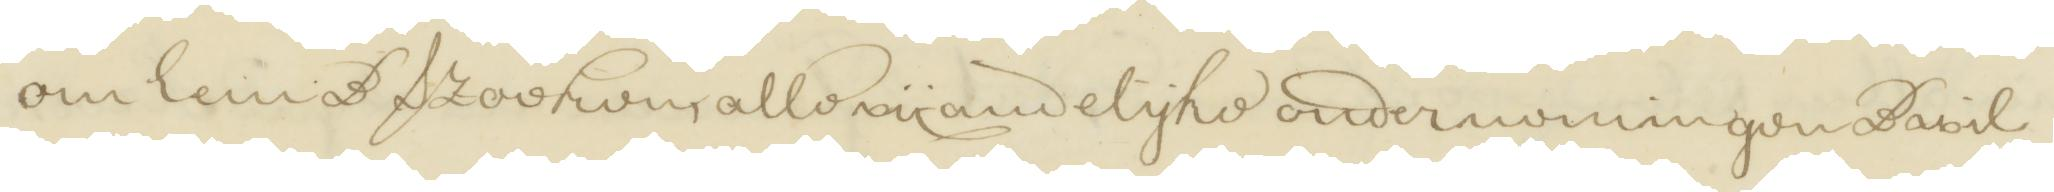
om hem te verzoeken, alle vijandelijke ondernemingen te wil
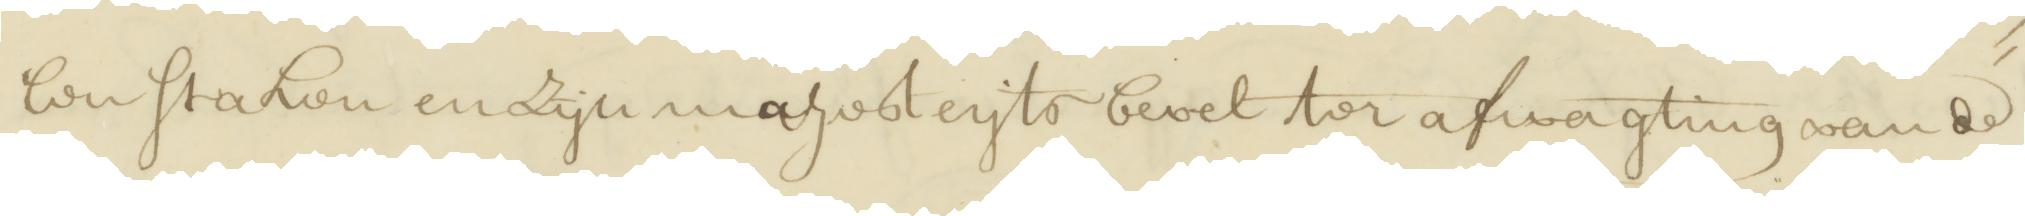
len staken en zijn majesteijts bevel ter afwagting van de
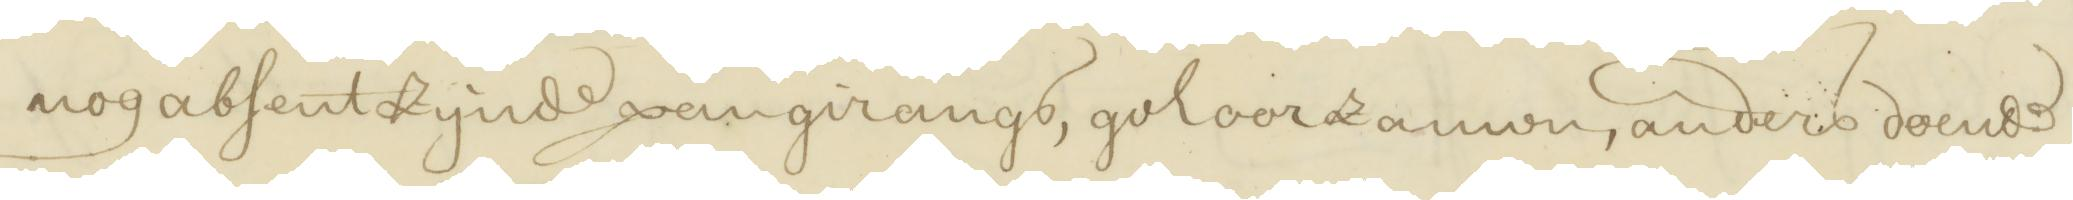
nog absent zijnde pangirangs, gehoorzamen, anders doende
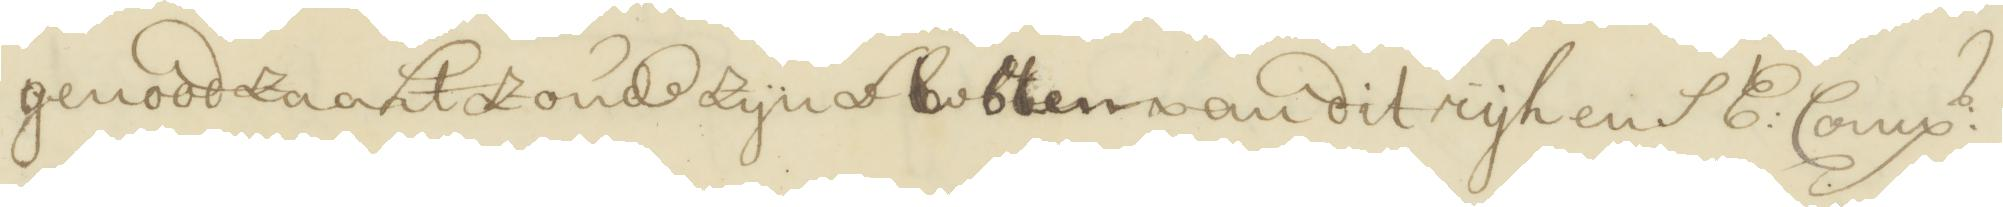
genoodzaakt zoude zijn te hebben van dit rijk en sE: Comp:s
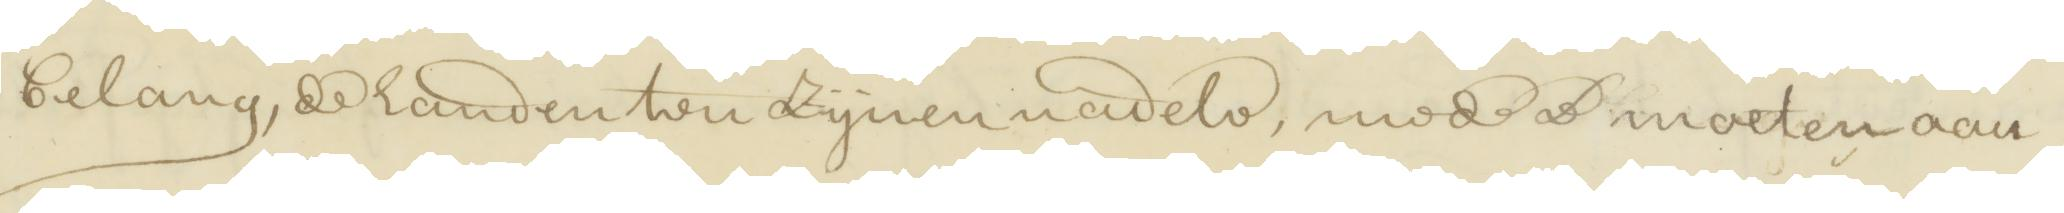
belang, de handen ten zijnen nadele, mede te moeten aan
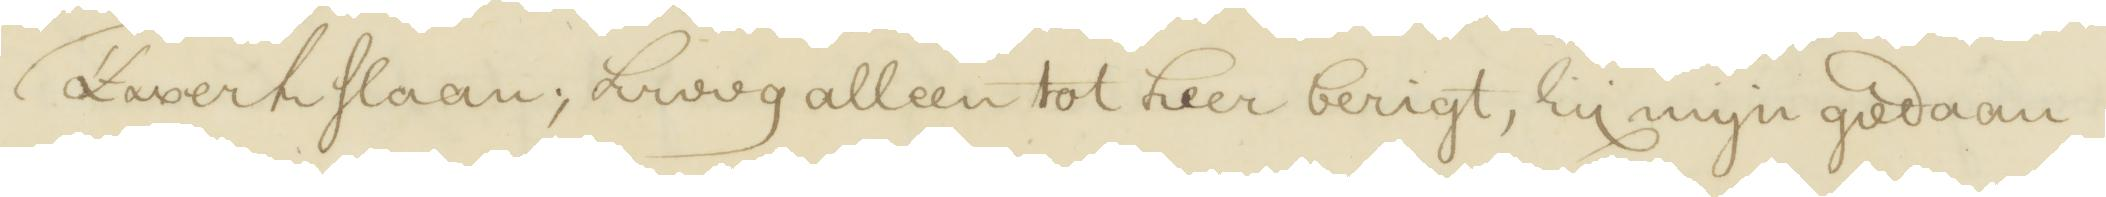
't werk slaan; kreeg alleen tot heer berigt, hij mijn gedaan
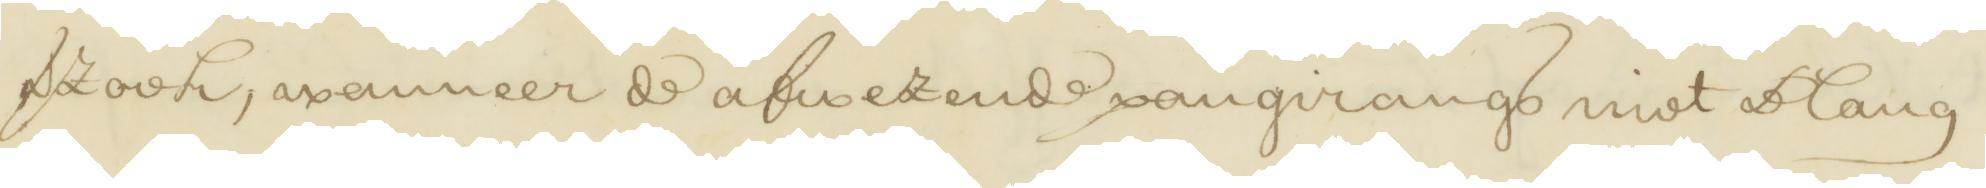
verzoek, wanneer de afwezende pangirangs niet te lang
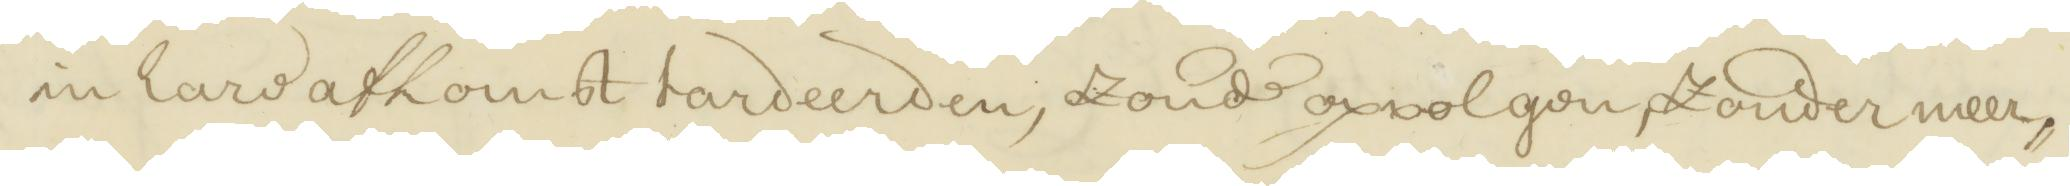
in hare afkomst tardeerden, zoude opvolgen, zonder meer„
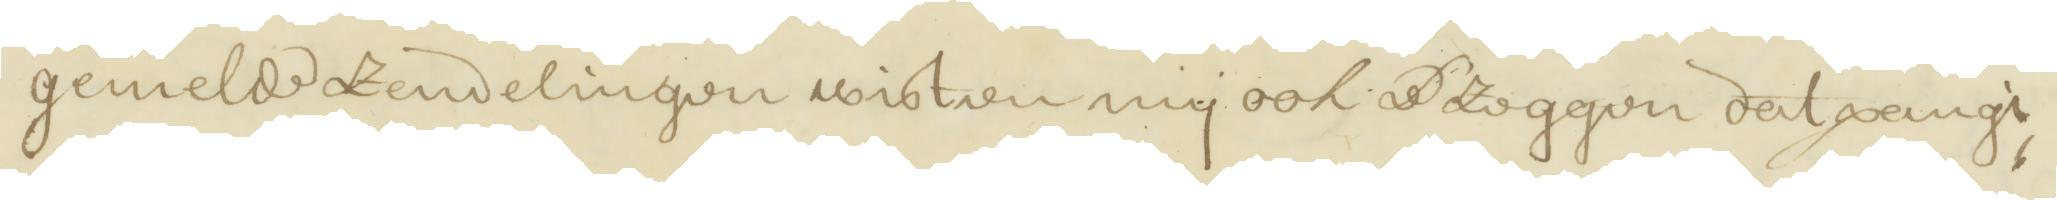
gemelde zendelingen wisten mij ook te zeggen dat pangi„
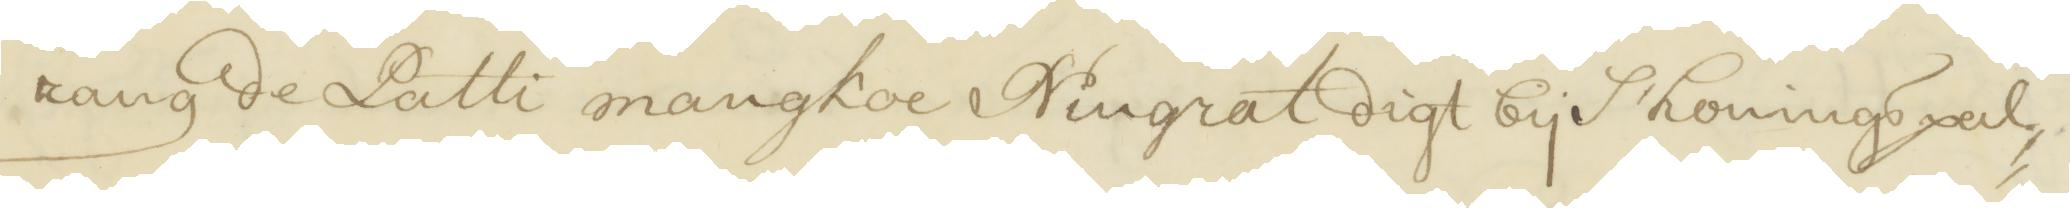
rang de Patti mangkoe Ningrat digt bij s'konings pal„
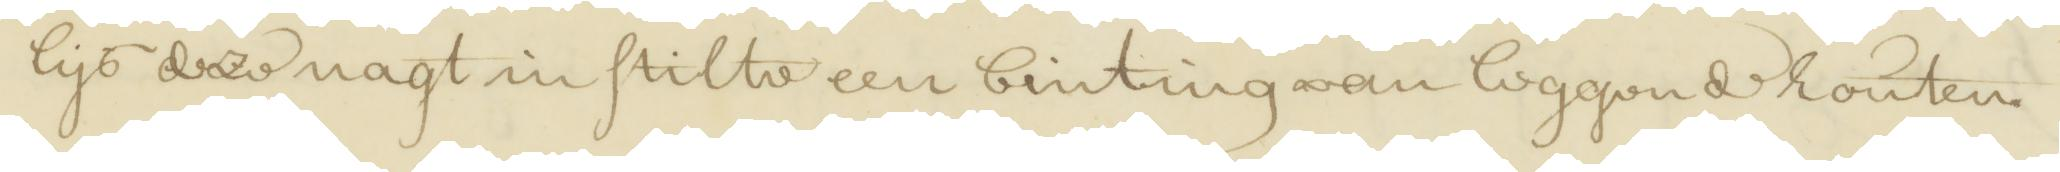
lijs deze nagt in stilte een binting van leggende houten
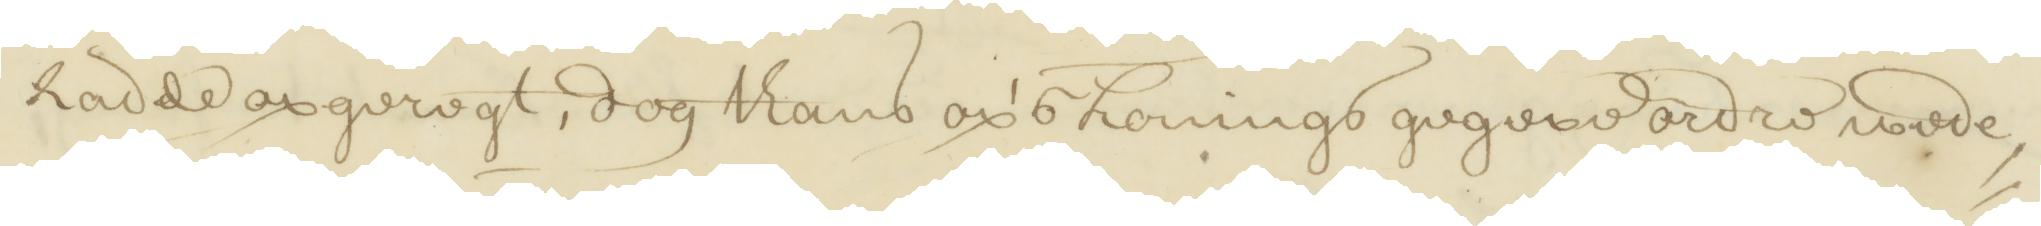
hadde opgeregt, dog thans op 's konings gegeve ordre wede„
